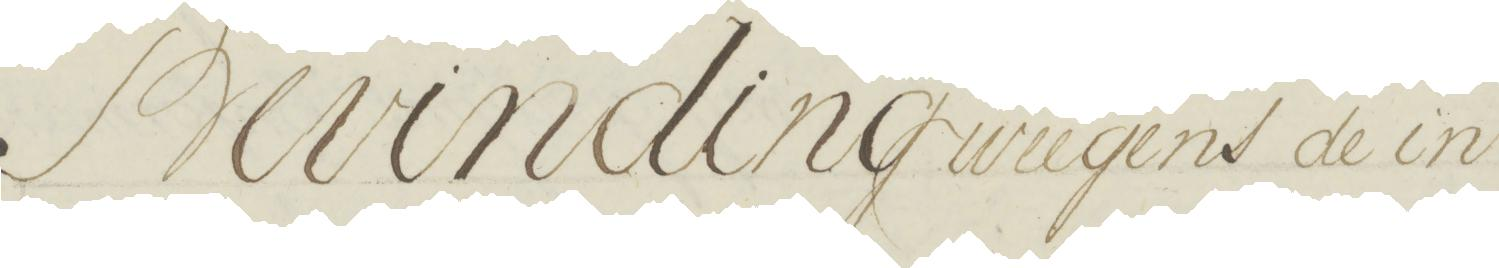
Bevinding weegens de in
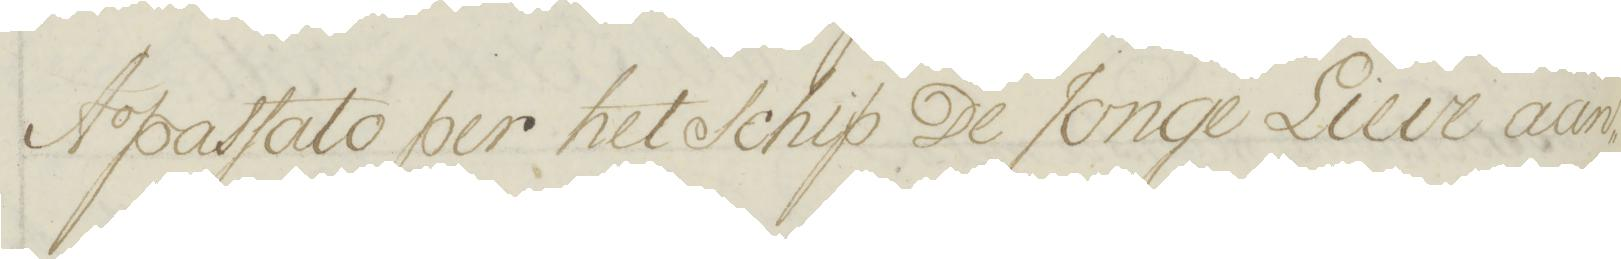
Ao passato per het schip De Jonge Lieve aan
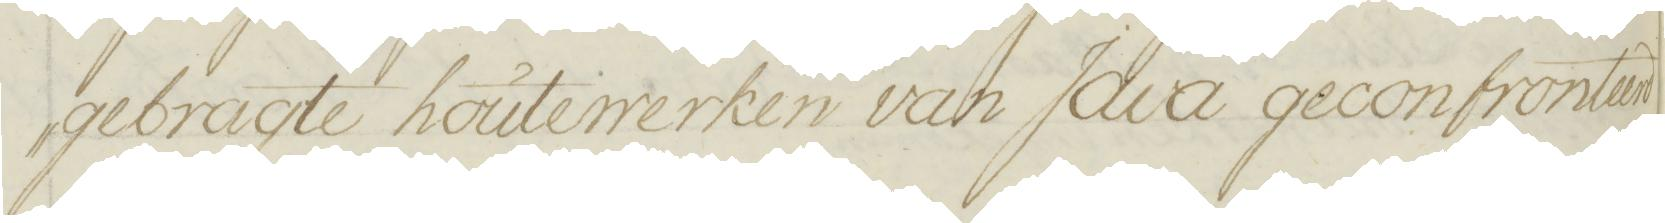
„gebragte houtewerken van Java geconfronteerd
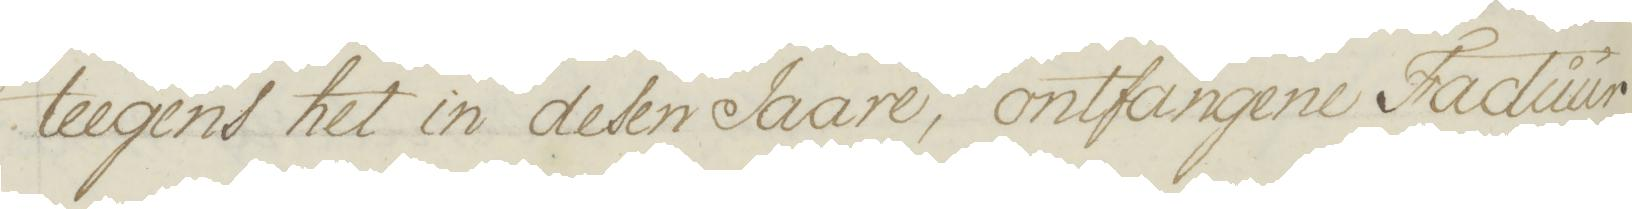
teegens het in desen Iaare, ontfangene Factuur
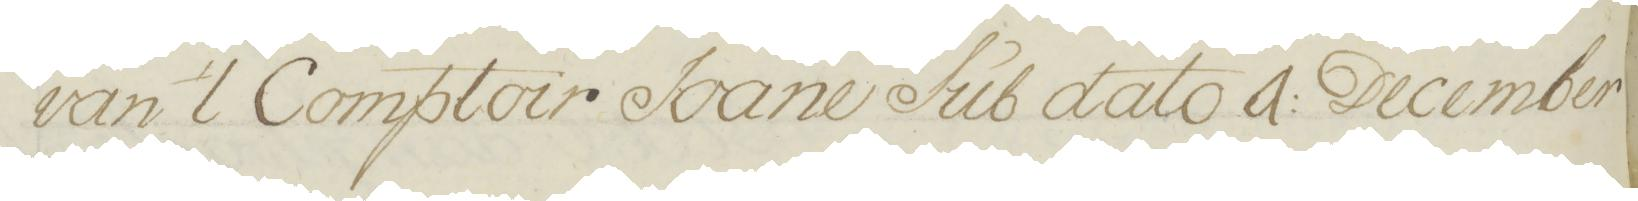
van ’t Comptoir Ioane Sub dato 4: December
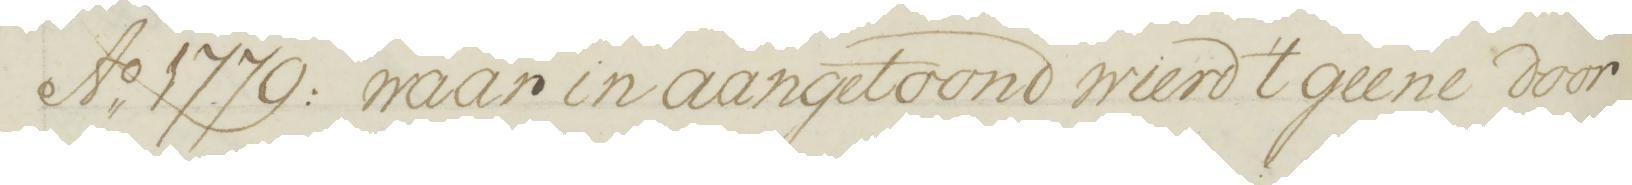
A„o 1779: waar in aangetoond wierd ’t geene door
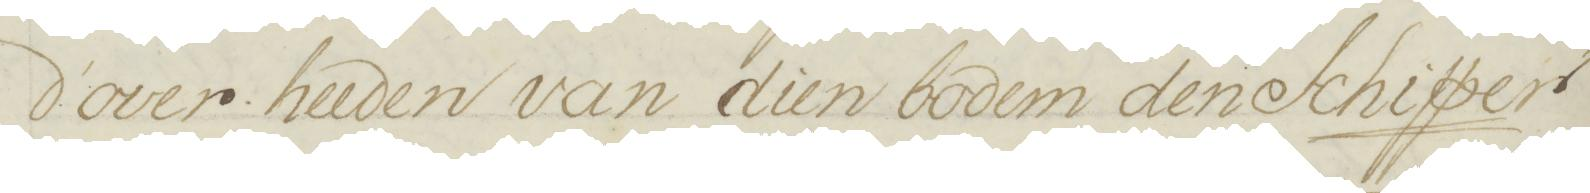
d’over . heeden van dien bodem den Schippers
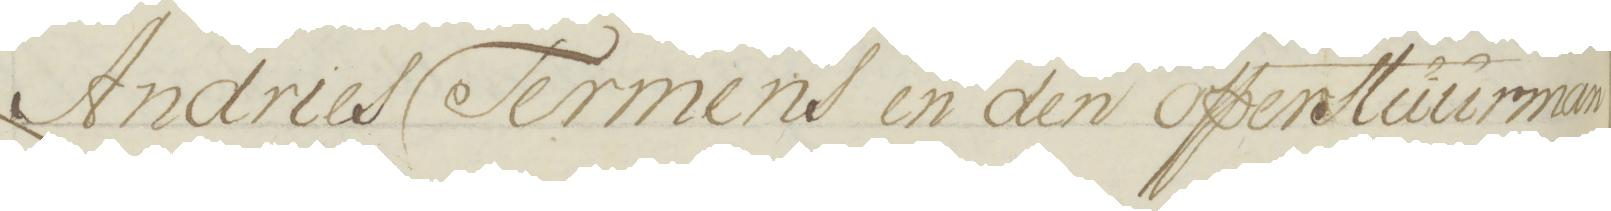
Andries Termens en den opperstuurman
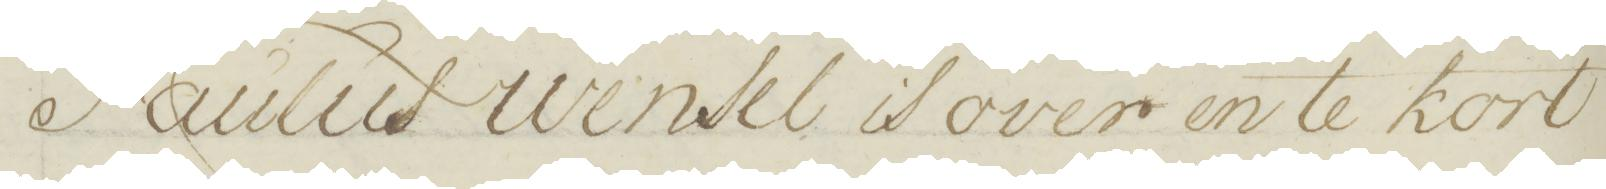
Paulus Wensel is over en te kort
